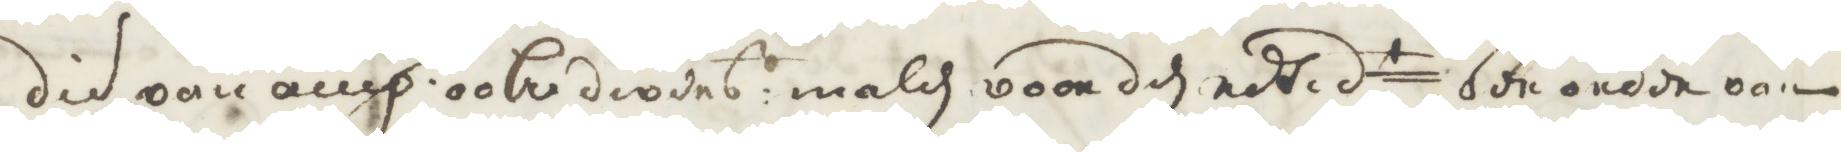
die van amp:le ook divers: malen voor den resid=t ter order van
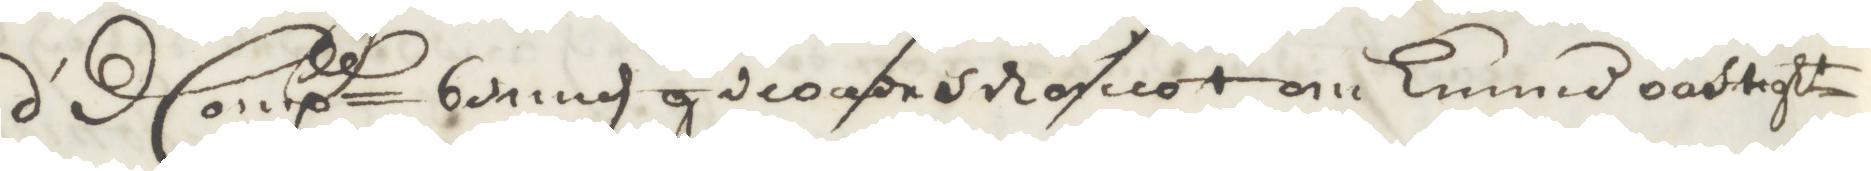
d’E Comp=e bennen gewaerschuwt om hunne vastigt=t
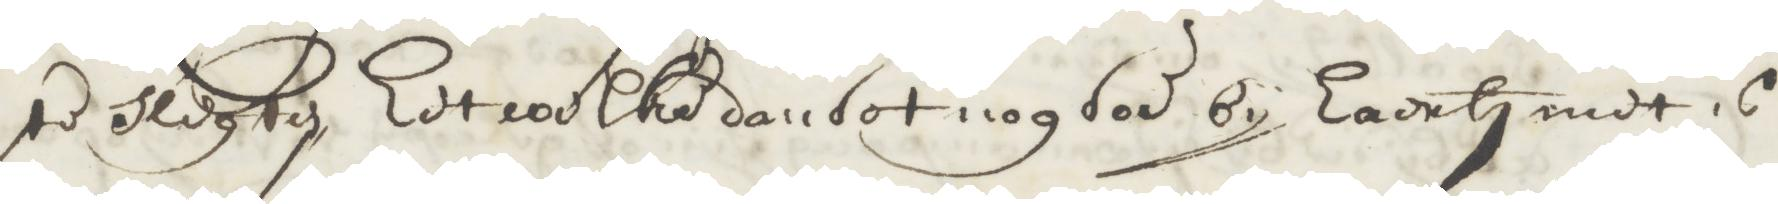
te slegten het welke dan tot nog toe bij hoerlijk niet is
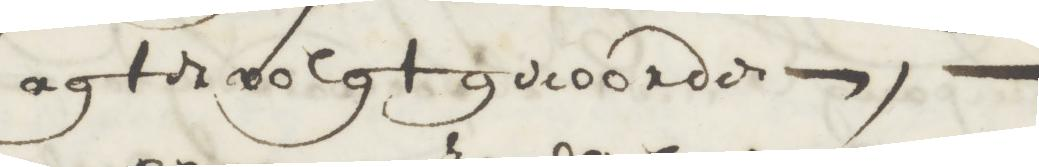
agtervolgt geworden—, —
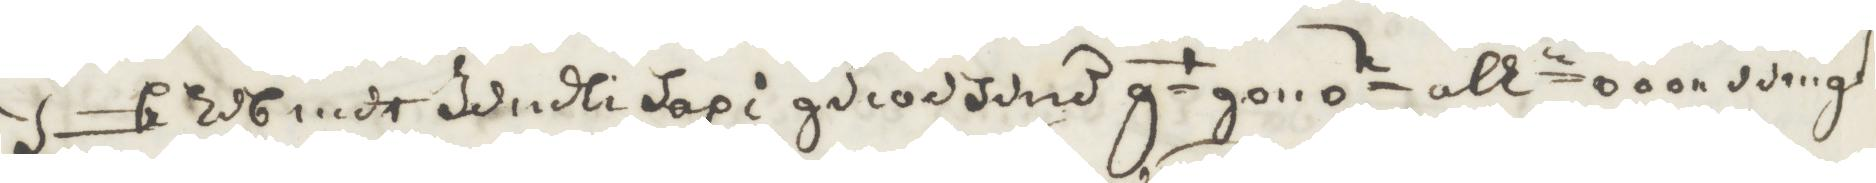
Ick heb met Ieneli Sapi gewesene g=t gond:k alh=r voor eenig
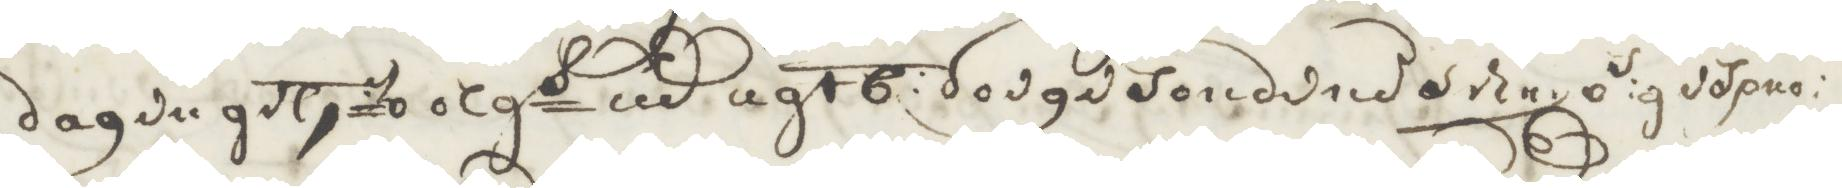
dagen gel=en volg=s uE agtb: toegesondene schrijv:s gespro:
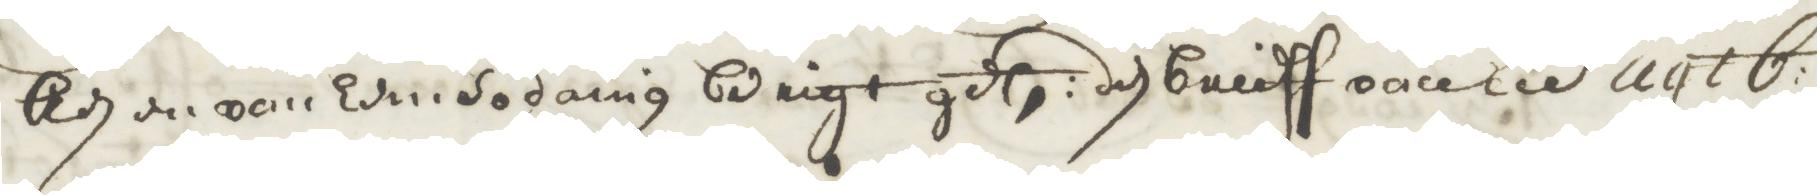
ken en van hem sodanig berigt gelijk den brieff van uE Agtb:
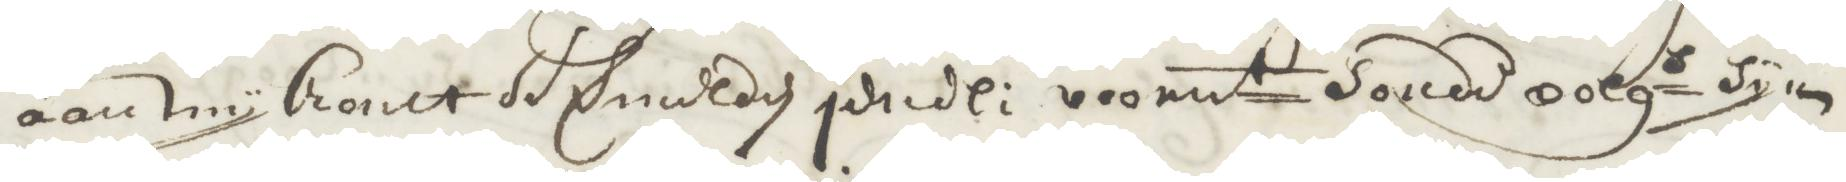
aan mij komt te vermelden jenel: voorn=t Soude volg=s sijn
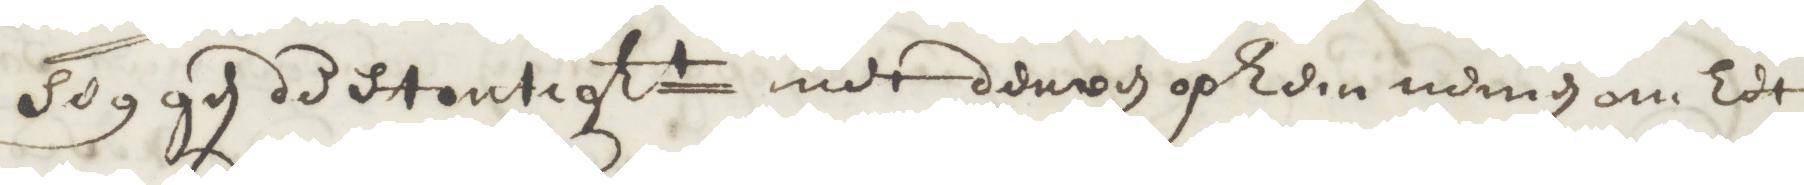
Seggen de stoutigh=t niet derven op hem nemen om het
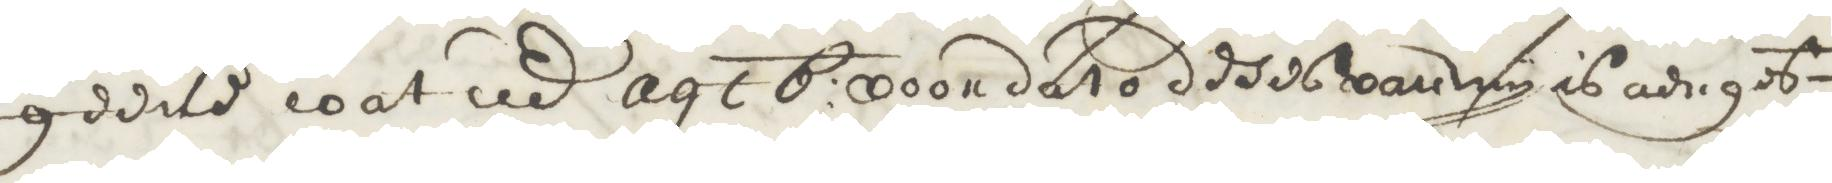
geene wat uE agtb: voor dato deses van mij is aen ges=
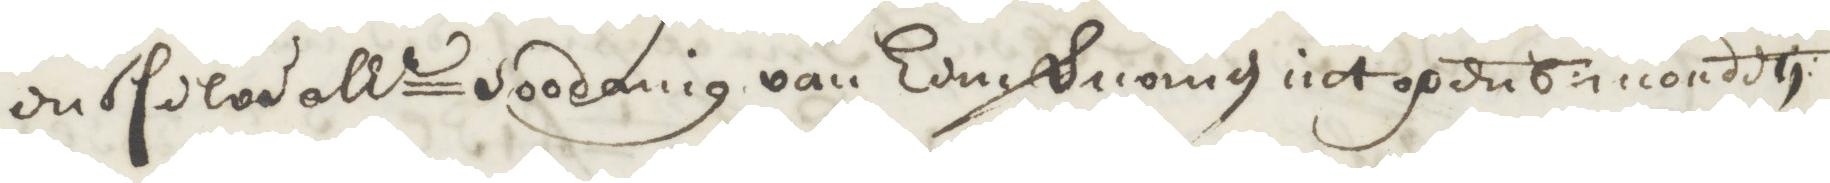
ent selve alh=r soodanig van hem vernomen int openb: mondelijk
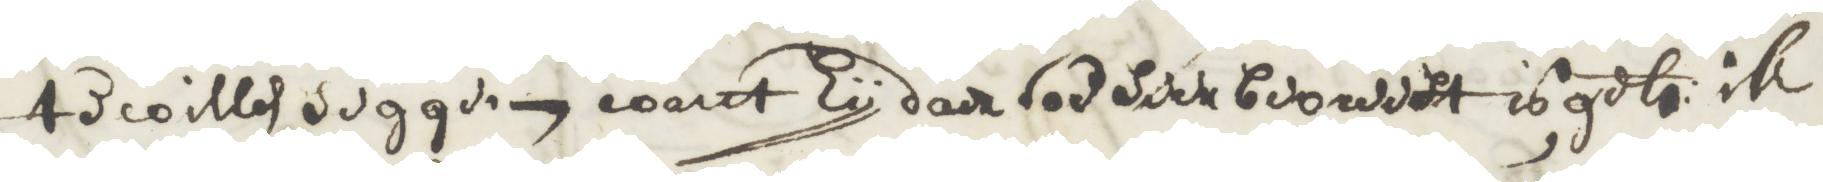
te willen seggen want hij daer toe seer bevreest is gelijk ik
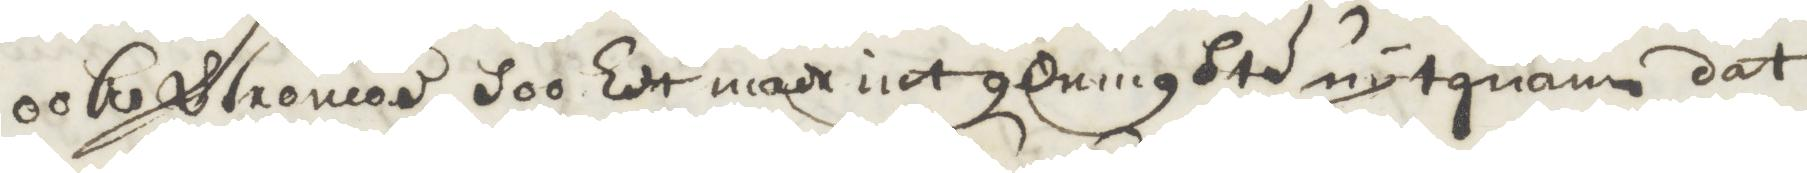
ook vertrouwe Soo het maer int geringste uijtquam dat
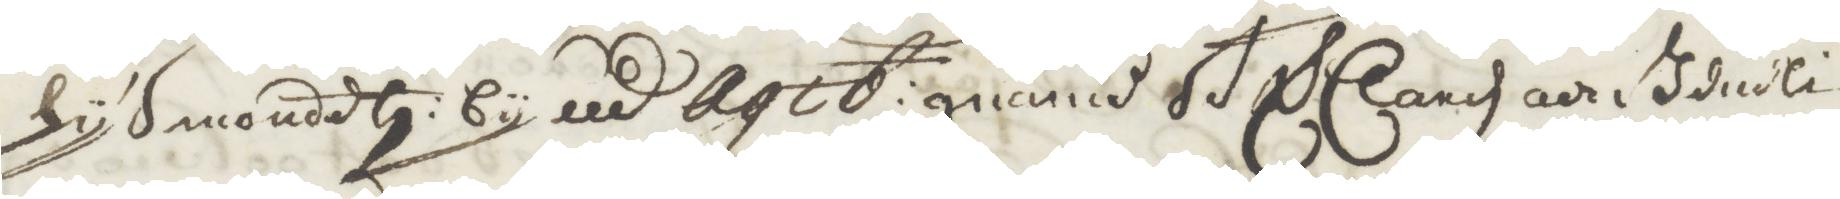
hij 't mondelijk bij uE Agtb: guame te verclaren aen Ieneli
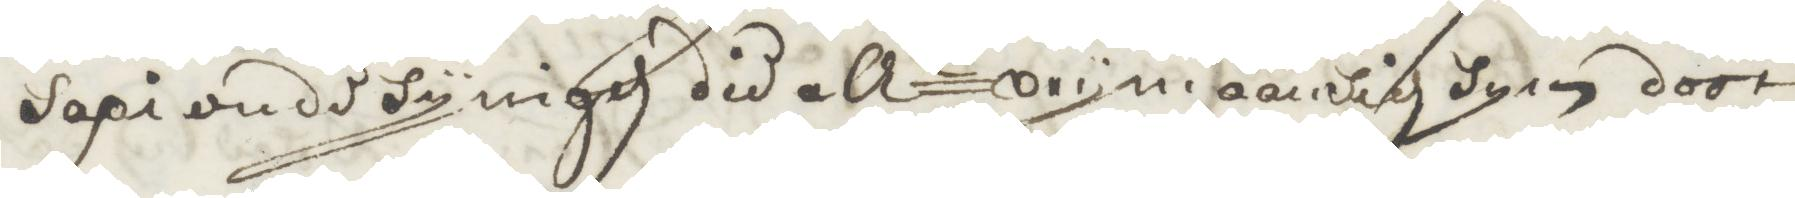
Sapi en de sijnigen die alh=r vrij in aansien Syn doot
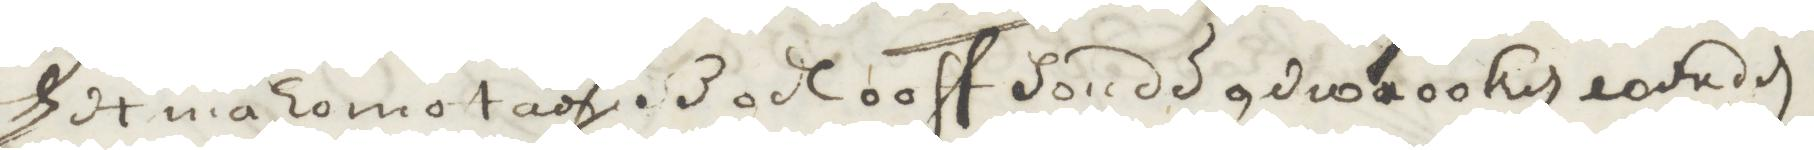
het mahomotaen Se gelooff Soude gewrooken werden
